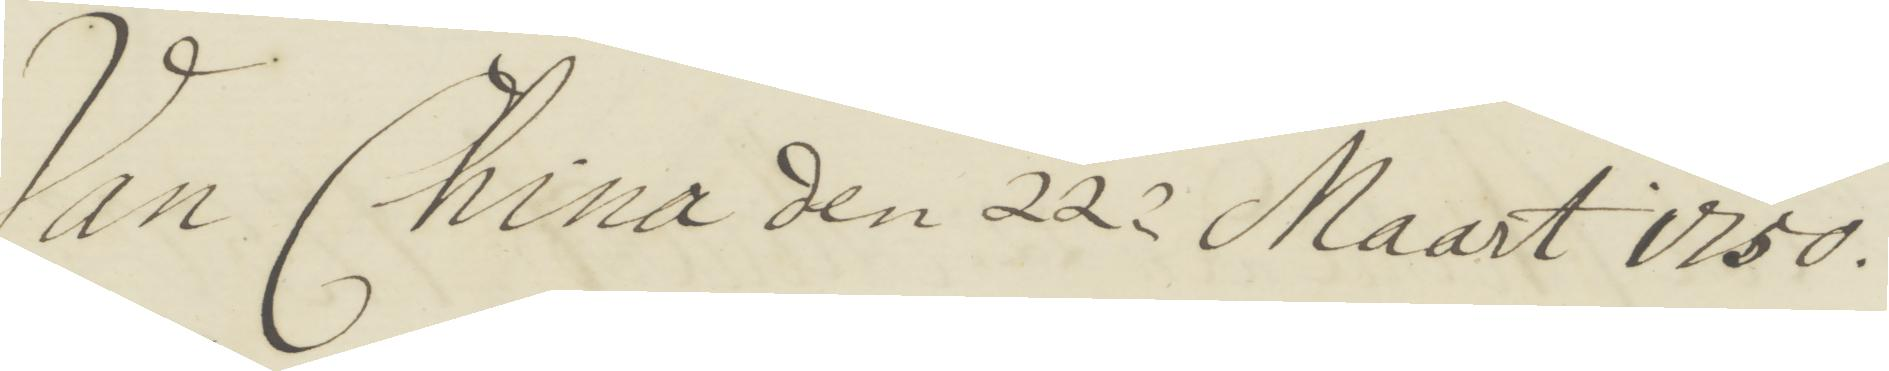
Van China den 22,' Maart 1750.
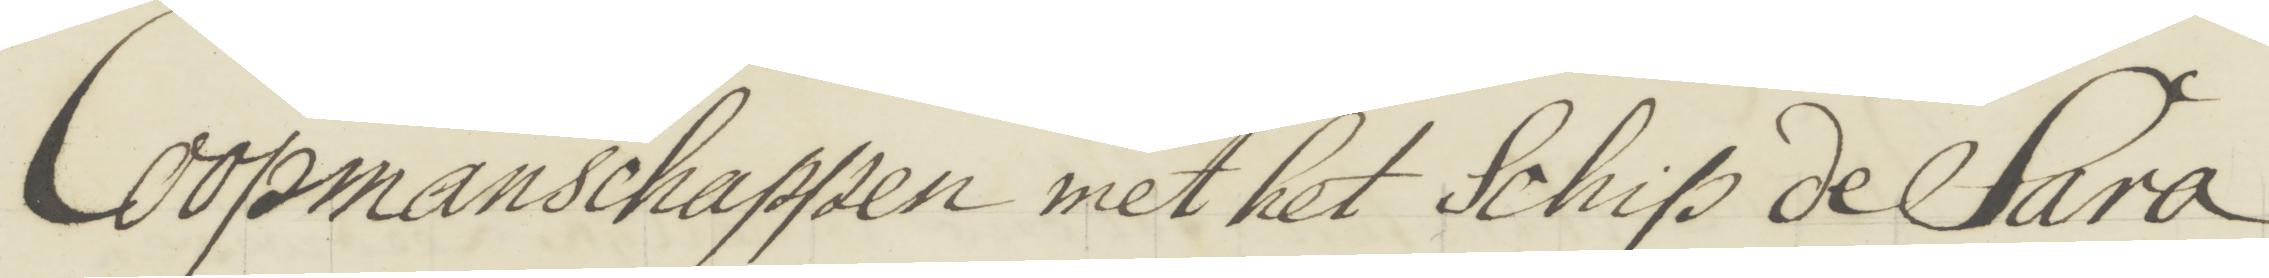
Coopmanschappen met het schip de Sara
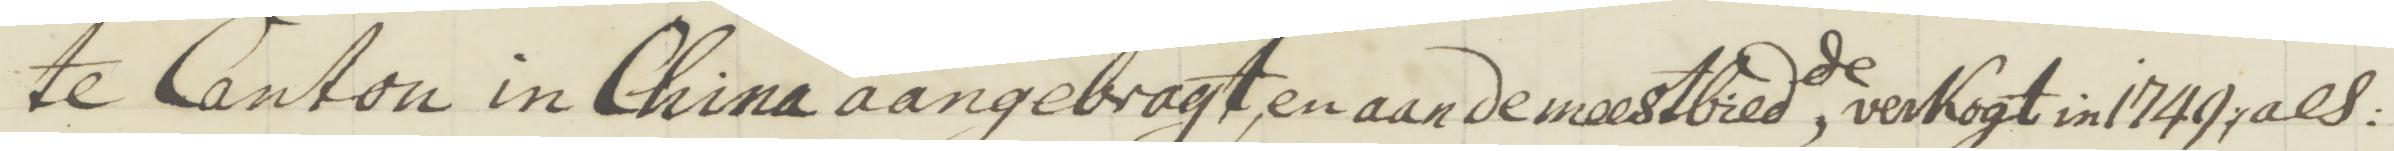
te Canton in China aangebragt, en aan de meestbied,de verkogt in 1749: als:
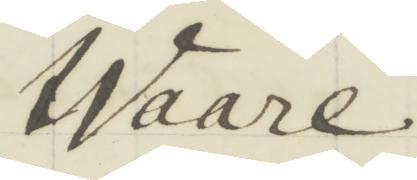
Waare
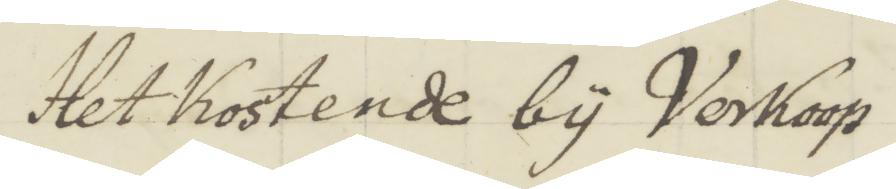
Het kostende bij Verkoop
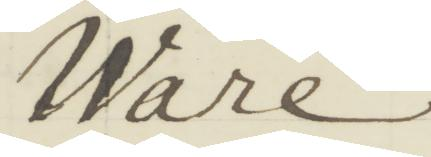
Ware
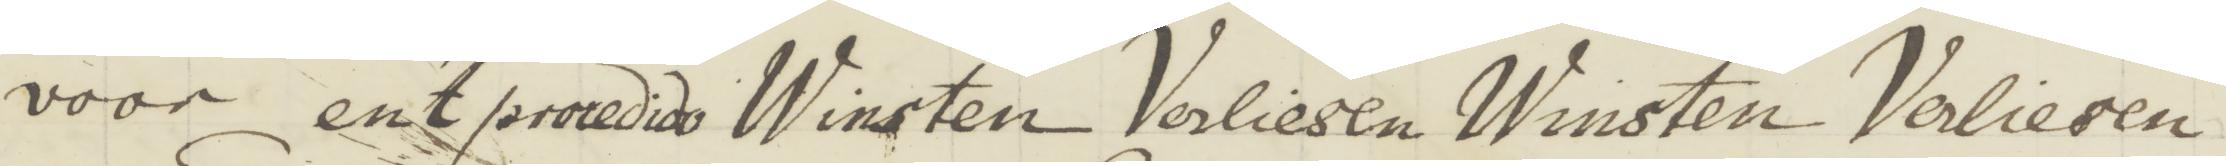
voor en't proredido Winsten Verliesen Winsten Verliesen
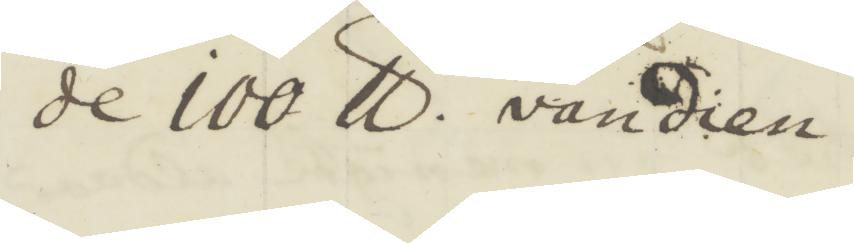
de 100 lb. van dien
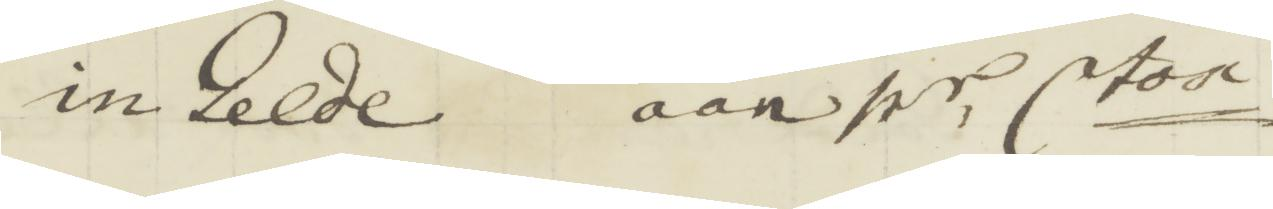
in zelde aan p,r C=ton
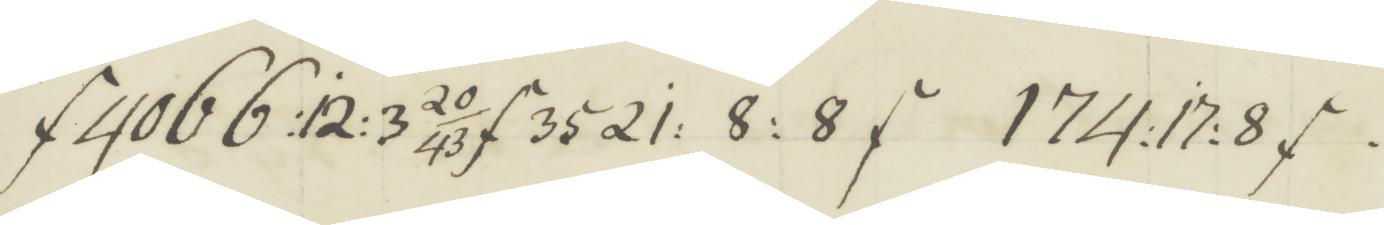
ƒ4066:12:3 20/43 ƒ 3521:8:8 ƒ 174:17:8 ƒ.
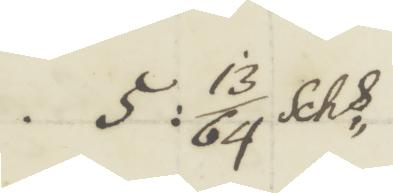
.5: 13/64 sch„s
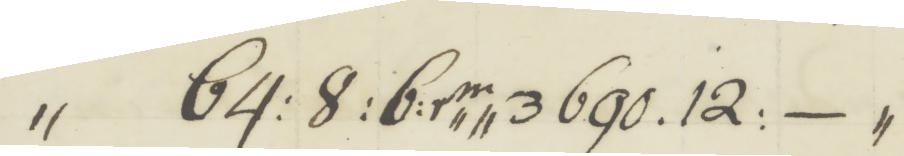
„ 64:8:6:r„m„3690.12: — „
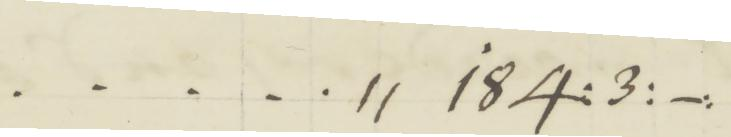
184:3:-:
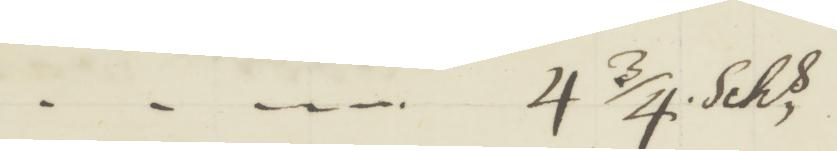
4 3/4. sch,s
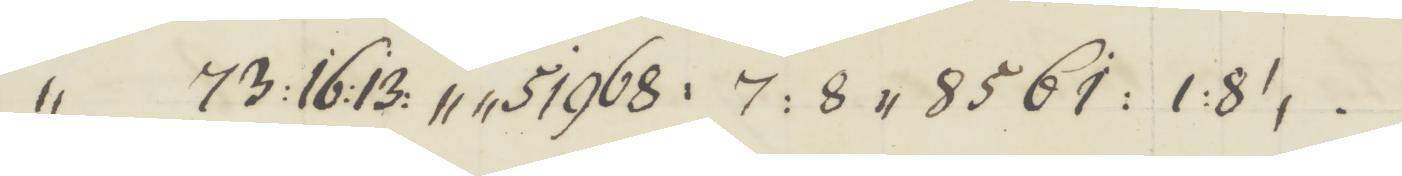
„ 73:16:13: „„51968:7:8„ 8561: 1:8',
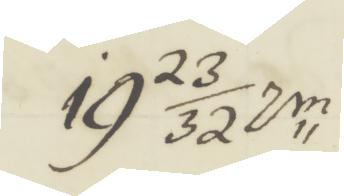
19 23/32r„m
